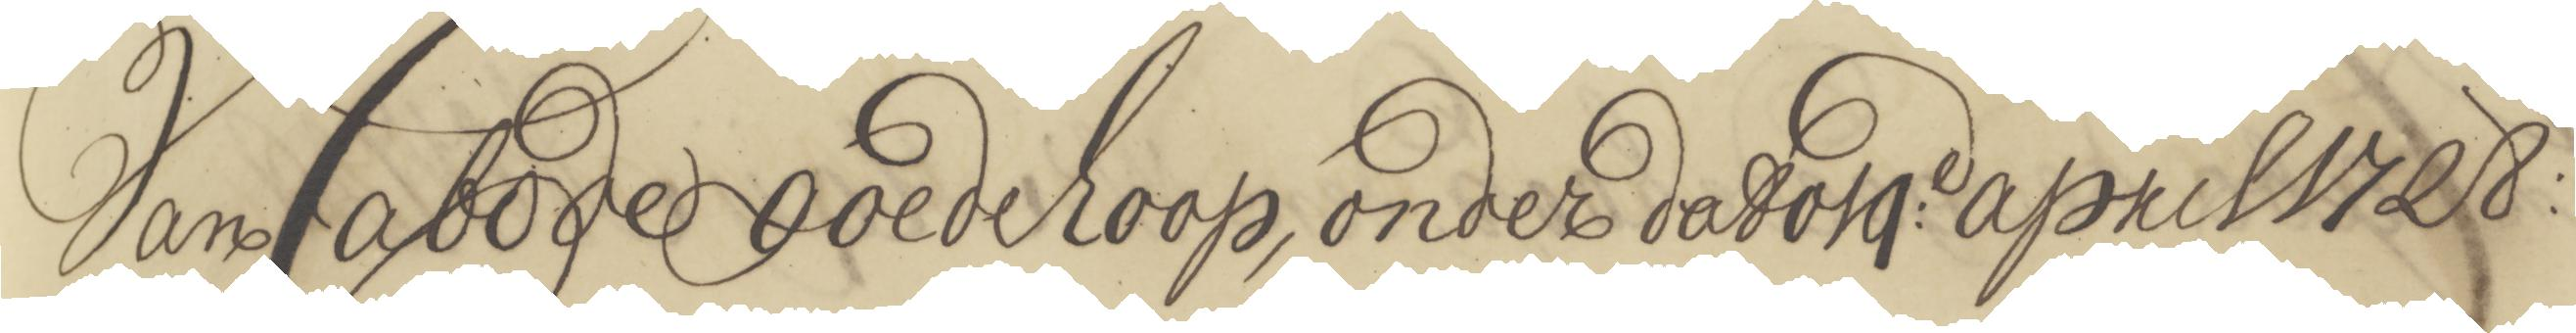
Van Cabo de goedehoop, onder dato 14:e april 1728:
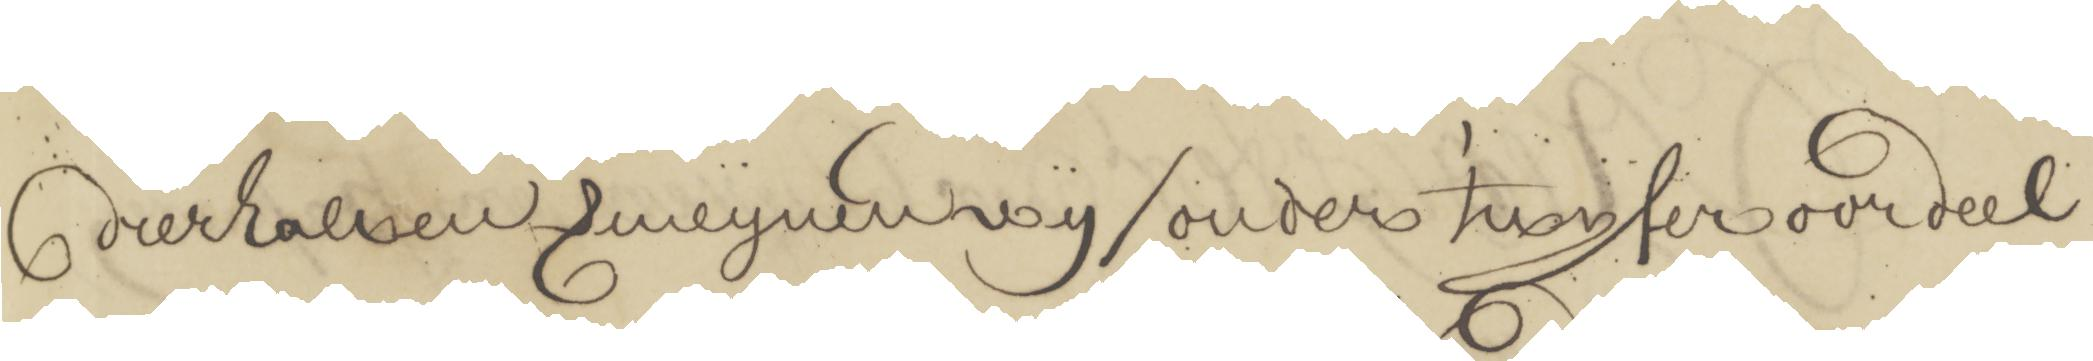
dierhalven vermeijnen wij / onder 'twijser oordeel
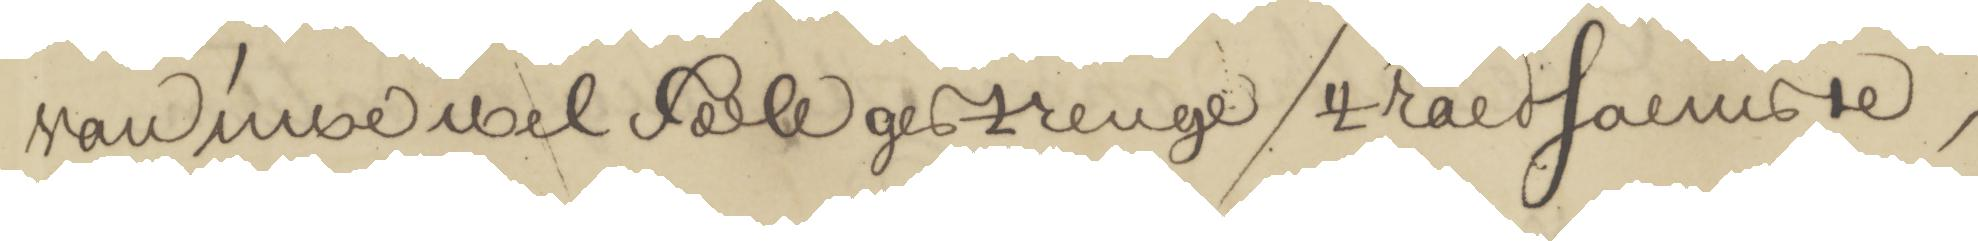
van uwe wel Edele gestrenge / ’t raedsaemste,
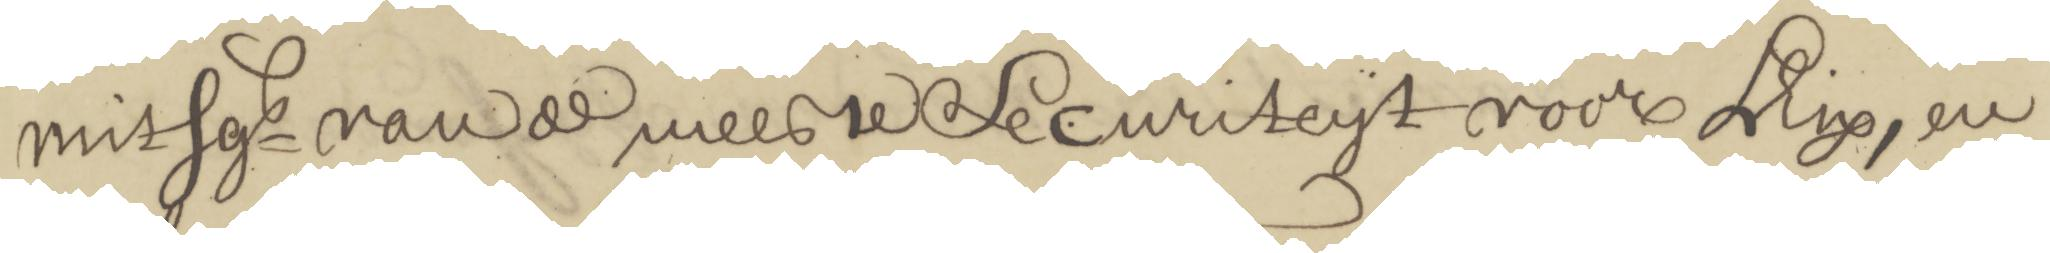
mitsg=s van de meeste securiteijt voor schip, en
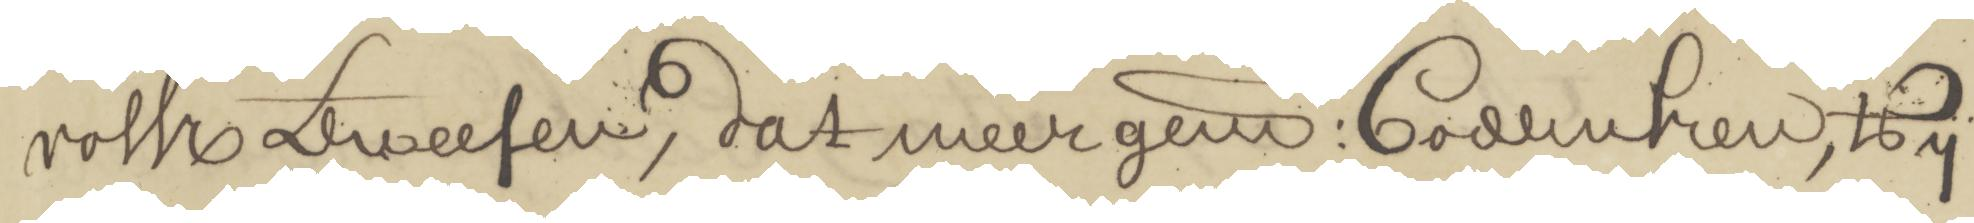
volk teweesen, dat meer gem: bodemken, 'tsij
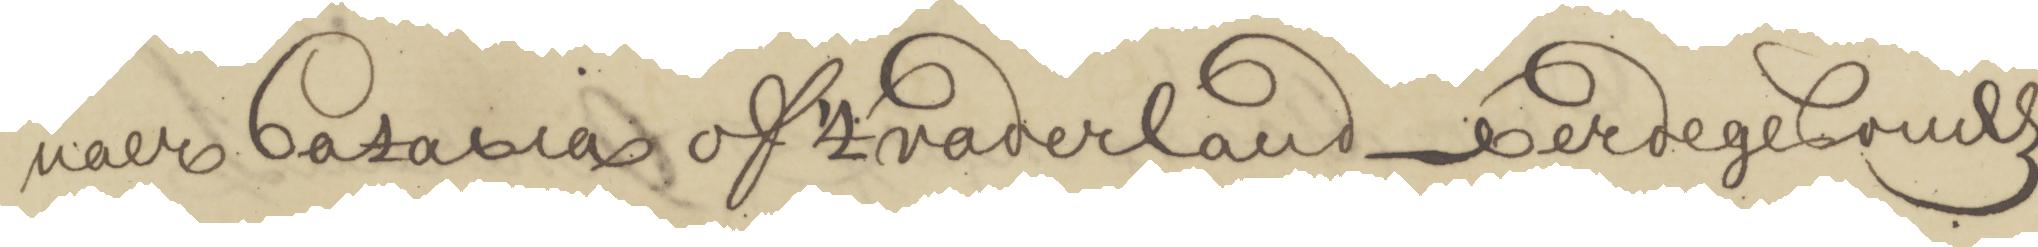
naer batavia of 't vaderland werdegesonden
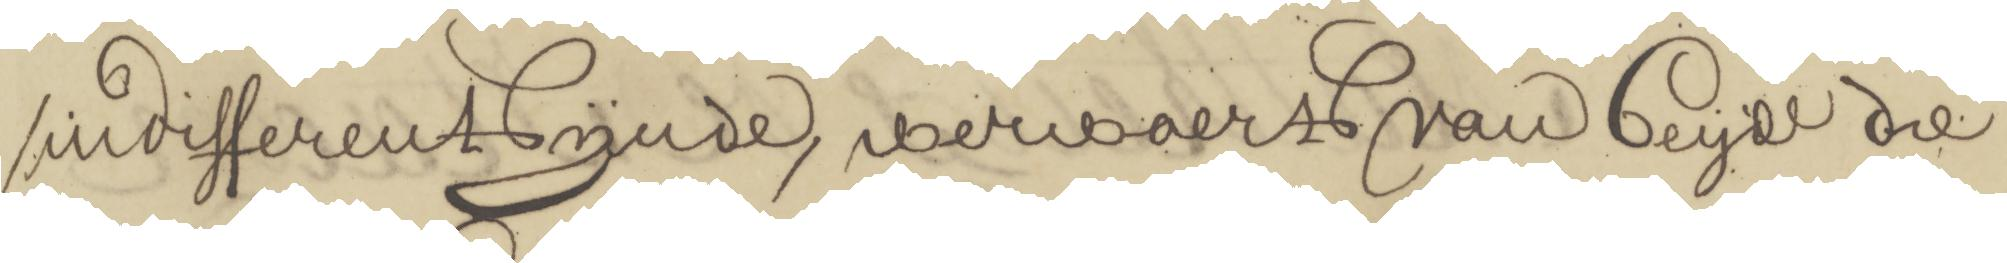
/indifferent sijnde, werwaerts van beijde die
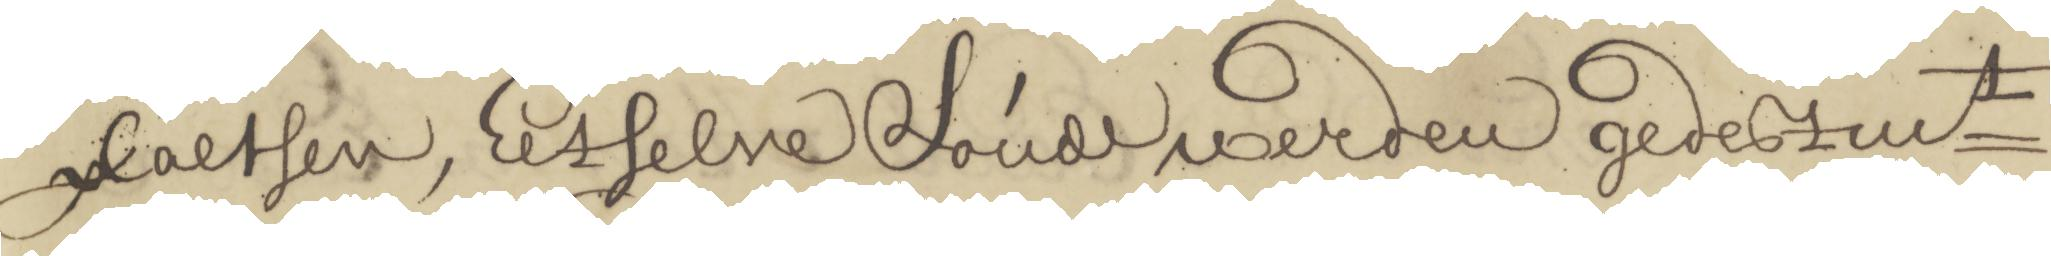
plaetsen, hetselve soude werden gedestin=t
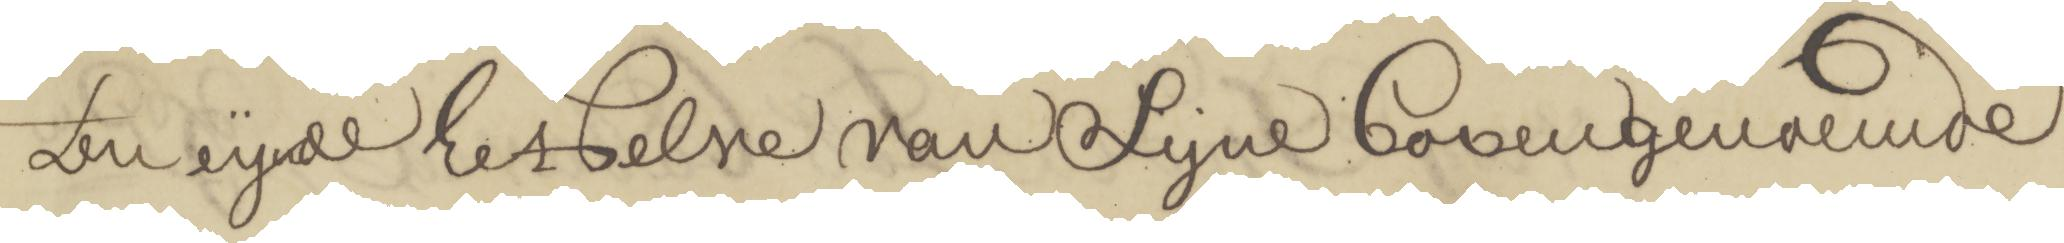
ten eijnde hetselve van sijne bovengenoemde
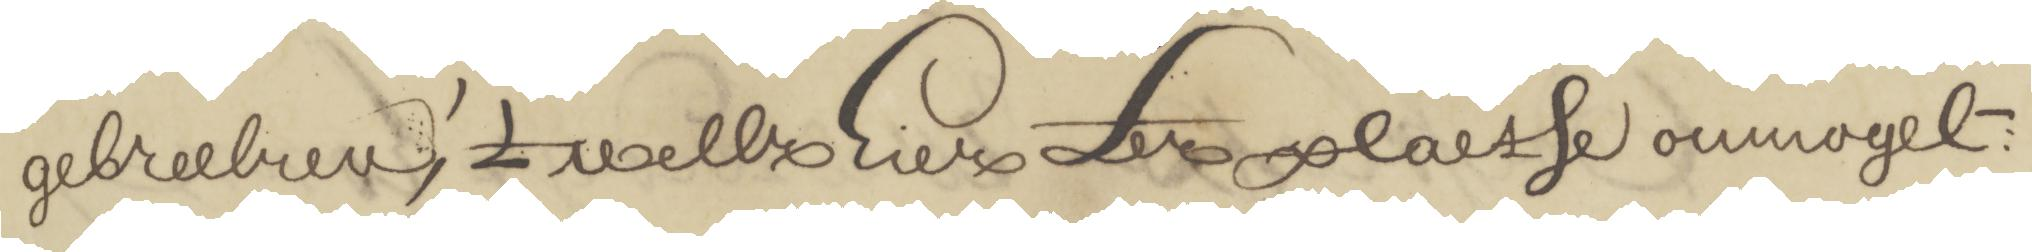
gebreeken, 't welk hier ter plaetse onmogelijk
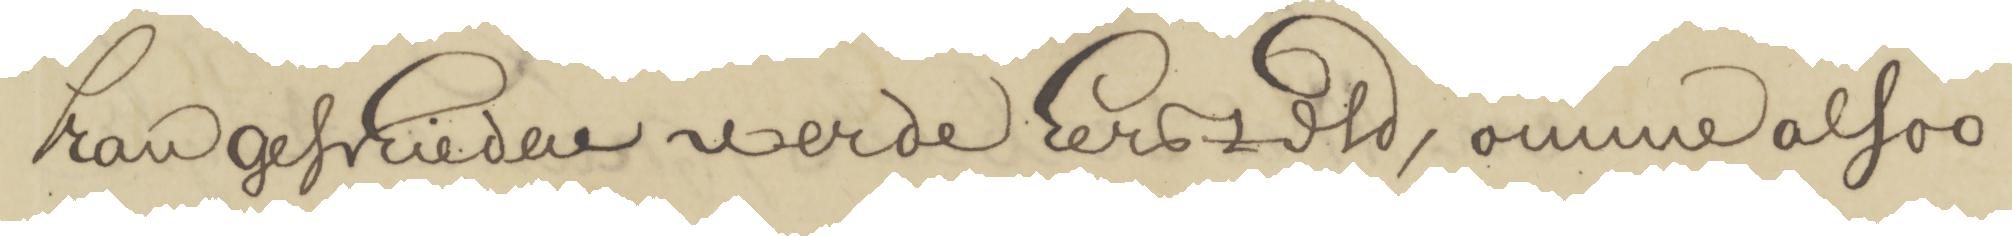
kan geschieden werde hersteld, omme alsoo
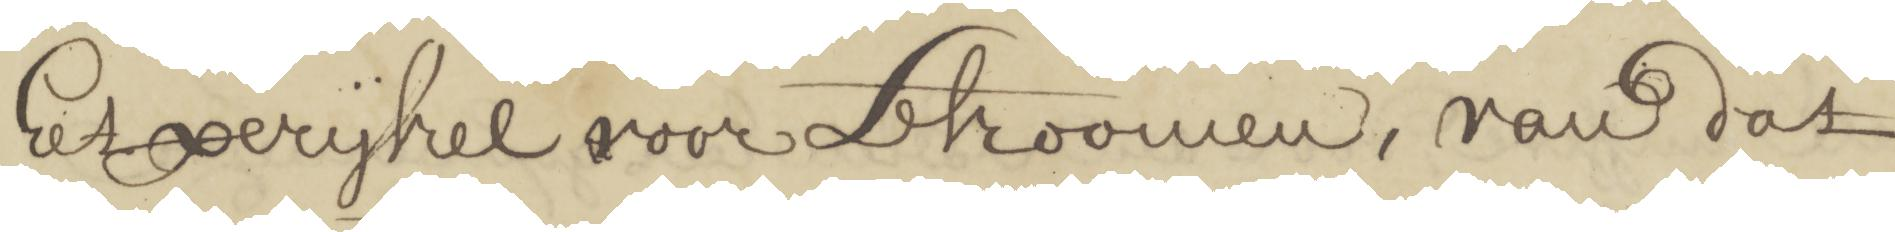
het perijkel voor tekoomen, van dat
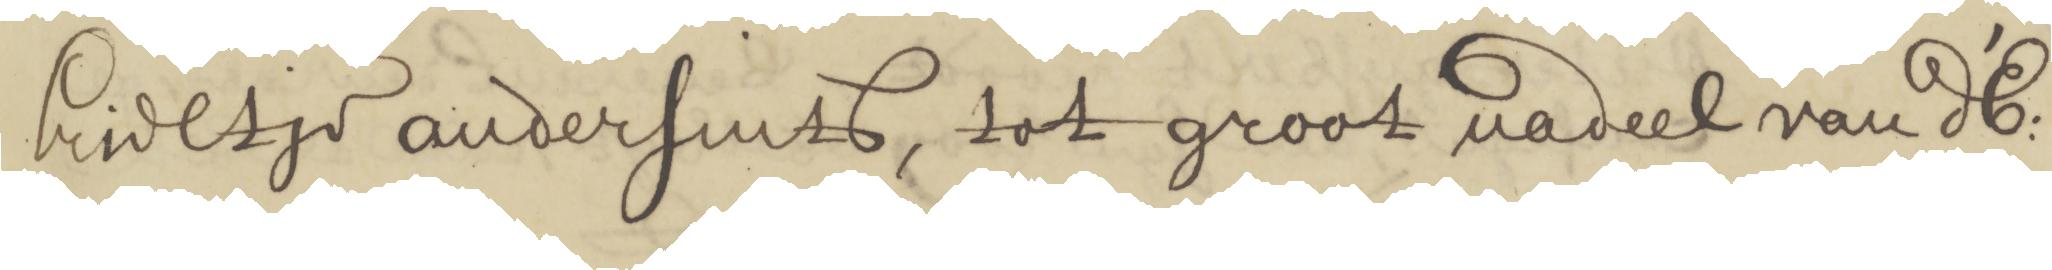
kieltje andersints, tot groot nadeel van d'E:
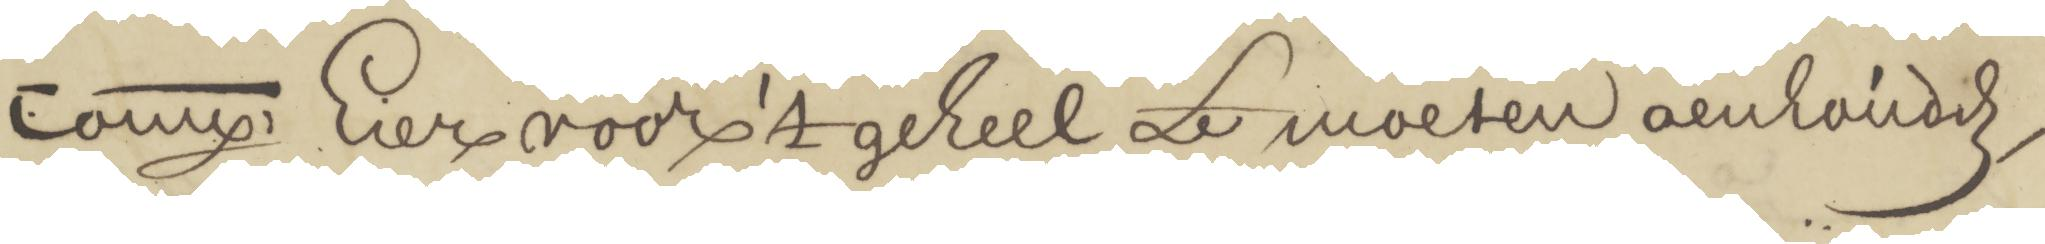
comp: hier voor ’t geheel te moeten aenhouden,
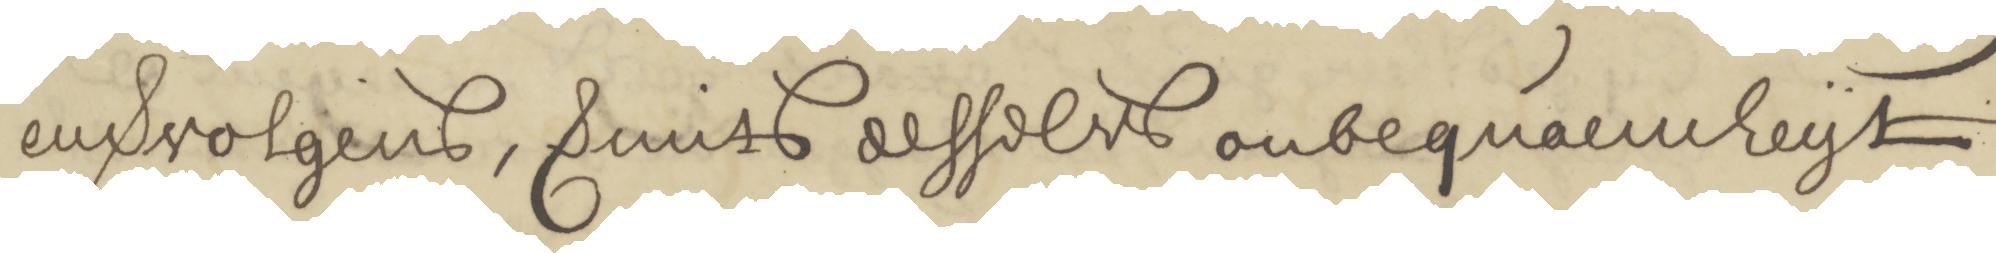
en vervolgens, vermits desselvs onbequaemheijt
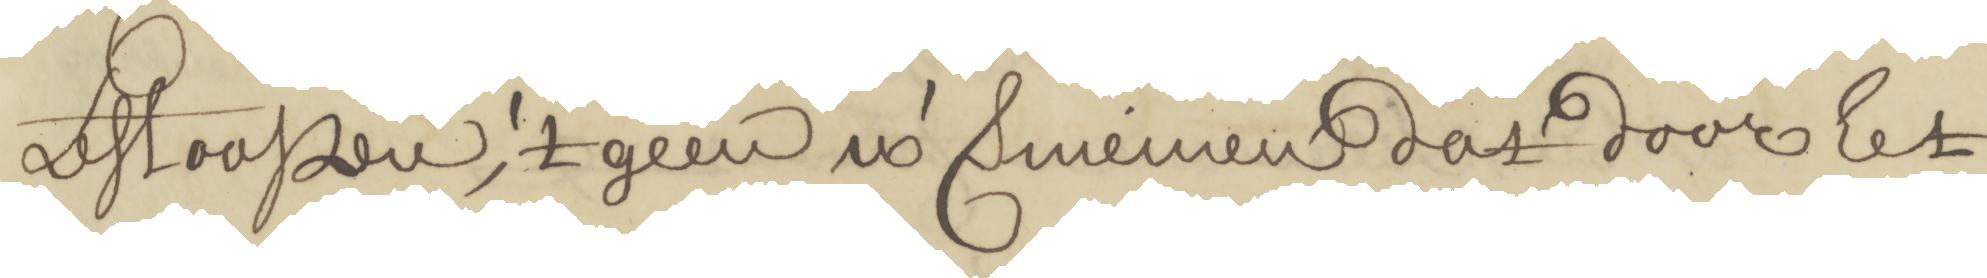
tesloopen, ’t geen w' vermeinen dat door het
